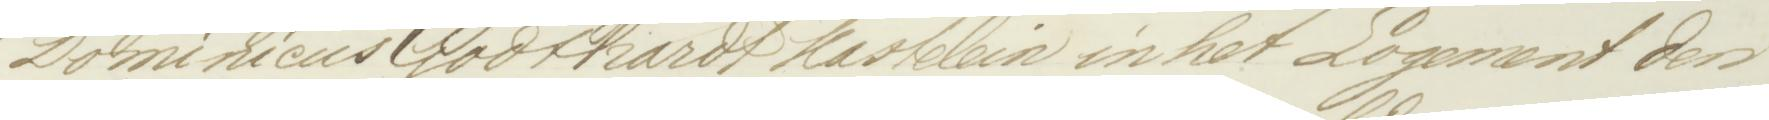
Dominicus Godthardt Kastelein in het Logement den
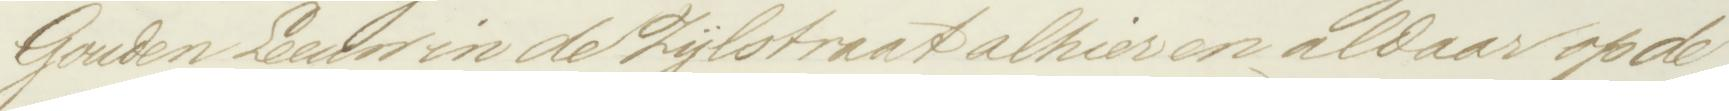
Gouden Leeuw in de Zijlstraat alhier en aldaar op de
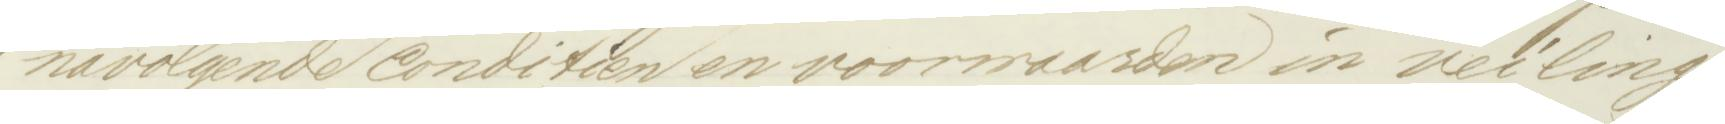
navolgende Conditien en voorwaarden in veiling
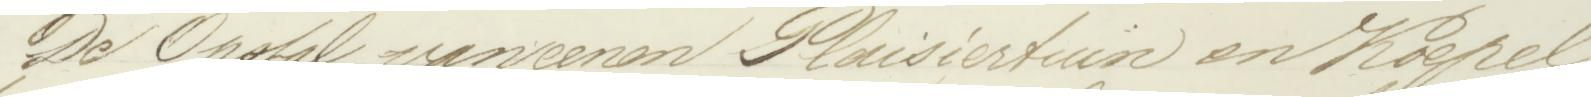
De Opstal van eenen Plaisiertuin en Koepel
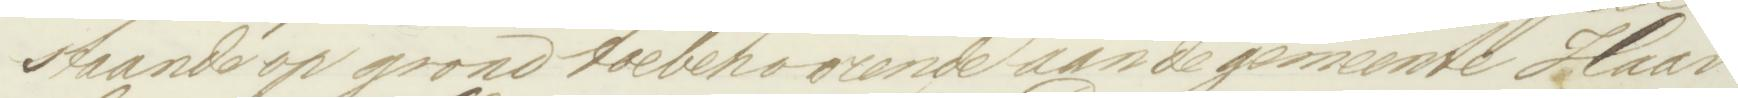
staande op grond toebehoorende aan de gemeente Haar
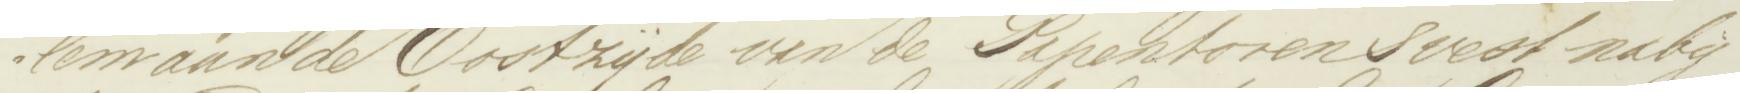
„lem aan de Oostzijde van de Papentorensvest nabij
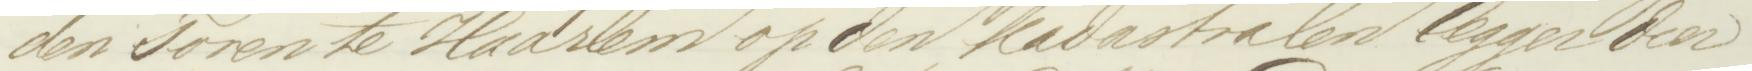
den Toren te Haarlem op den Kadastralen legger dier
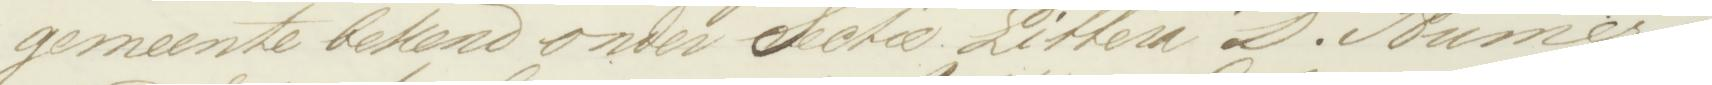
gemeente bekend onder sectie Littera D. Numero
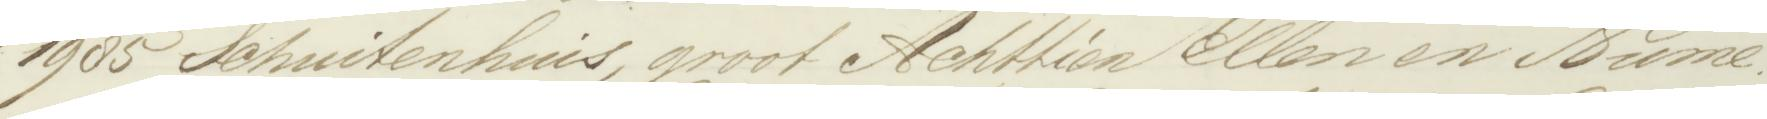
1985 schuitenhuis, groot Achttien Ellen en Nume
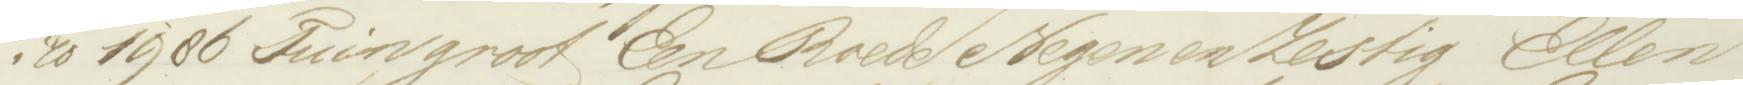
„ro 1986 Tuin groot Een Roede Negen en Zestig Ellen
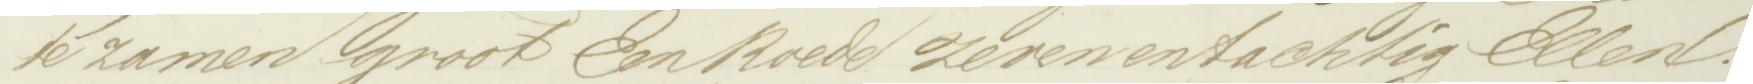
te zamen groot Een Roede zeven en tachtig Ellen.
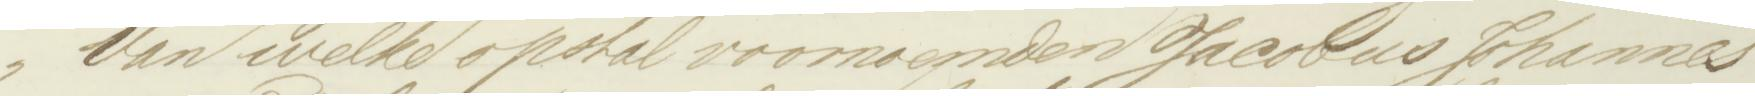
„ van welke opstal voornoemden Jacobus Johannes
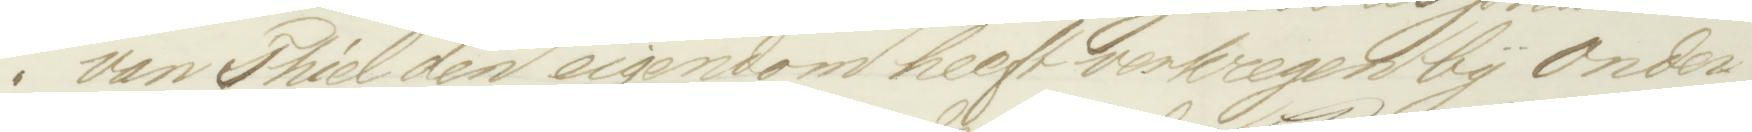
van Thiel den eigendom heeft verkregen bij Onder
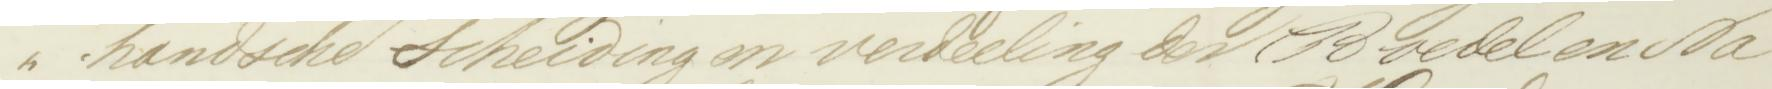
„ handsche scheiding en verdeeling der Boedel en Na
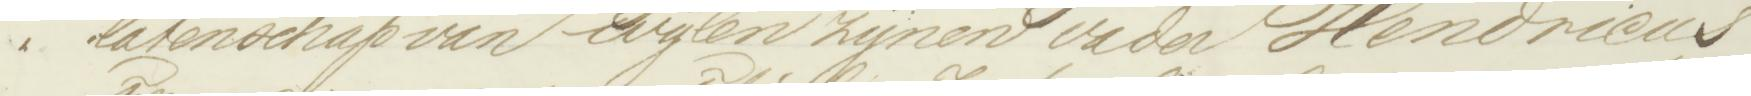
„ latenschap van wijlen zijnen order Hendricus
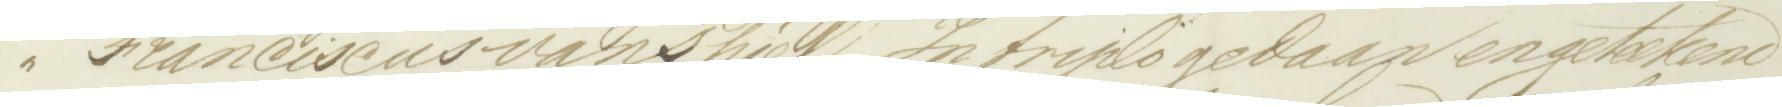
„ Franciscus van Thiel, In triplo gedaan en geteekend
